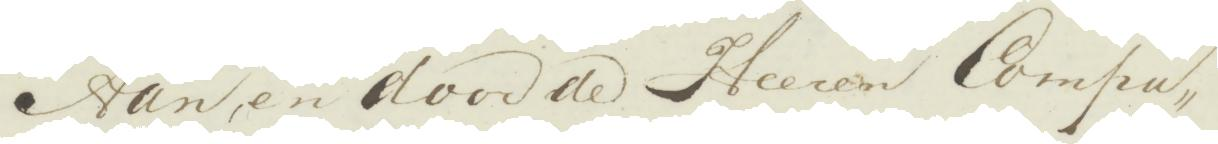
Aan, en door de Heeren Compa„
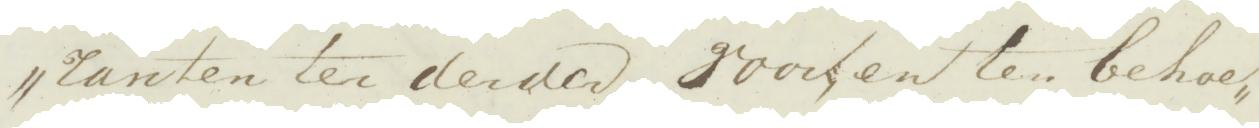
„ranten ter derder voor en ten behoe„
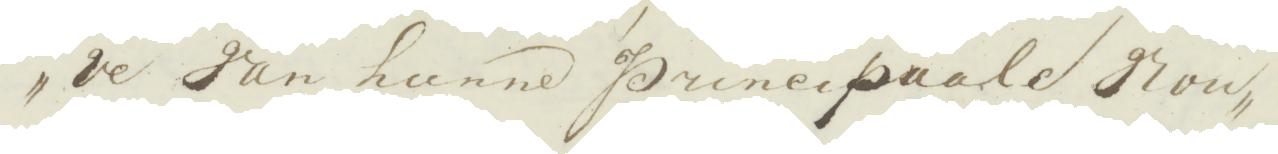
„ve van hunne Principaale Vrou„
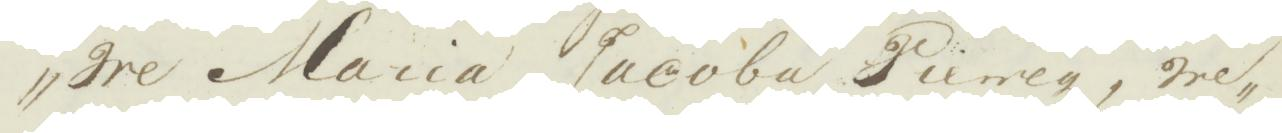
„we Maria Jacoba Vieweg, we„
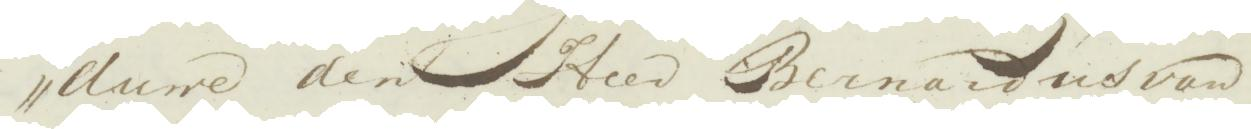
„duwe der Heer Bernardus van
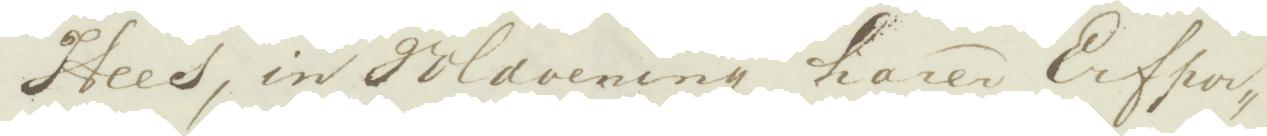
Hees, in voldoening harer Erfpor„
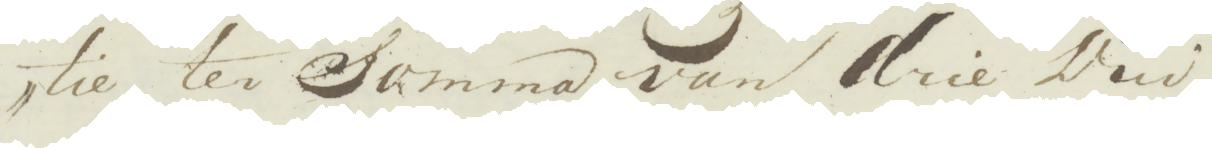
„tie ter somma van drie dui
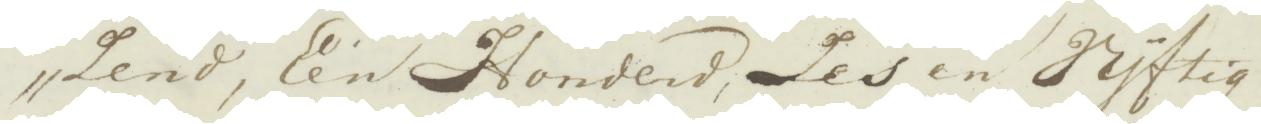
„zend, Een Honderd, Zes en Vijftig
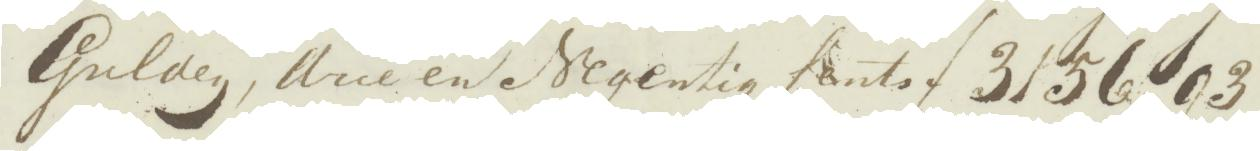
Gulden, drie en Negentig Cents ƒ 3156, 93
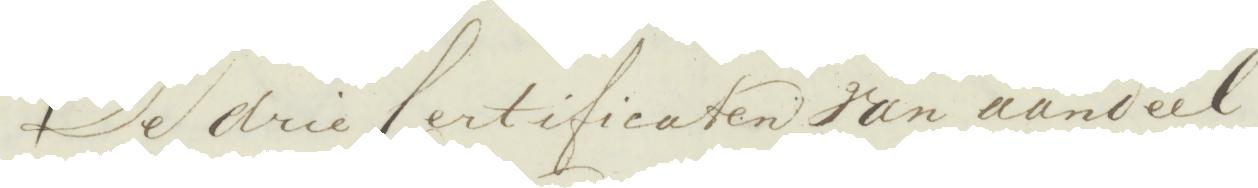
De drie Certificaten van aandeel
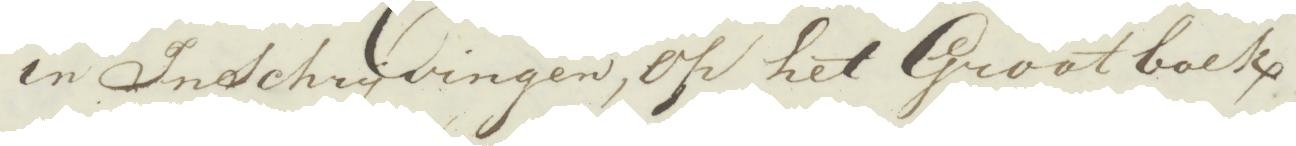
in Inschrijvingen, op het Grootboek
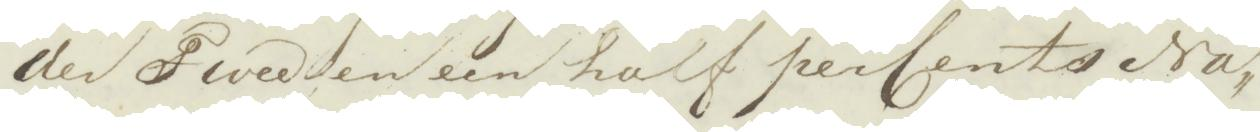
der Twee en een half perCents Na„
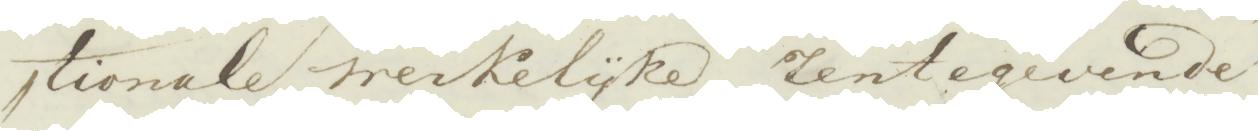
tionale werkelijke rentegevende
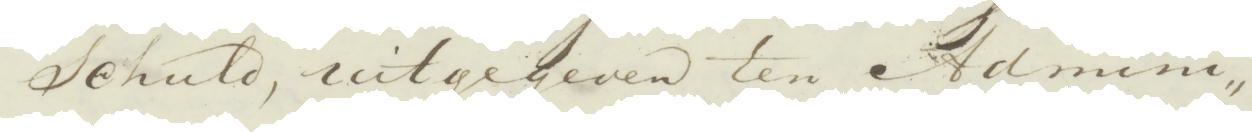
schuld, uitgegeven ten Admini„
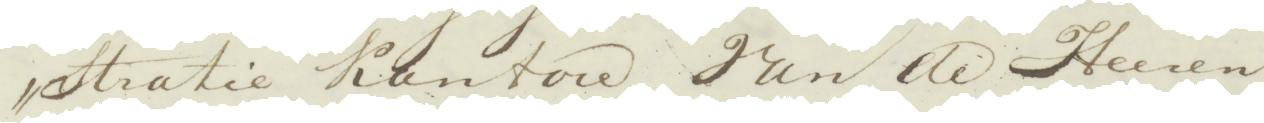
„stratie Kantore Van de Heeren
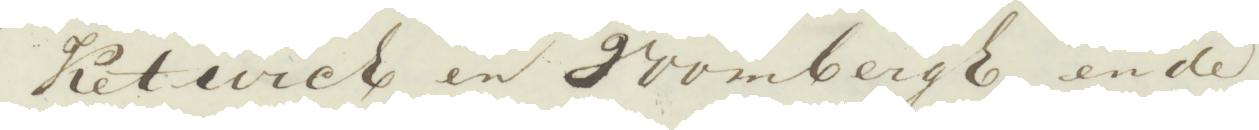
Ketwich en Voombergh, en de
